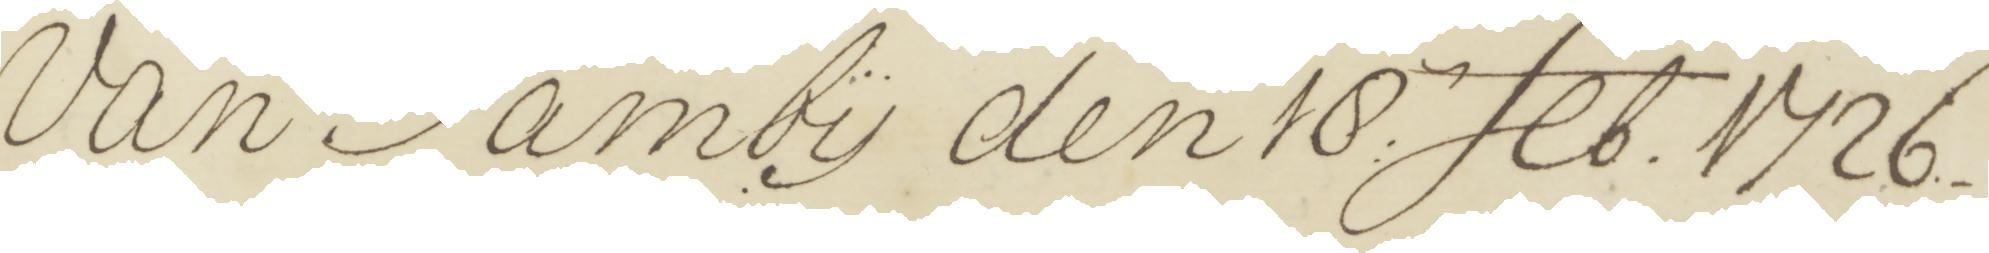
Van Iambij den 18:en feb. 1726. —
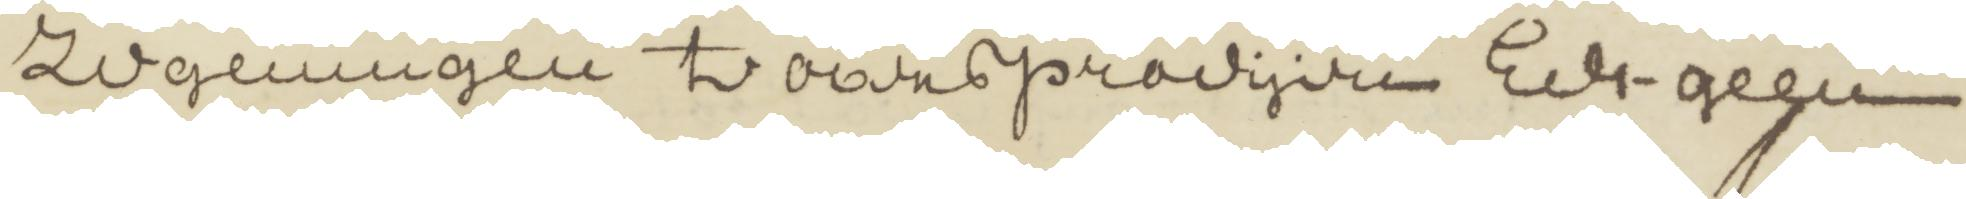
zegeningen te oversproeijen het geen
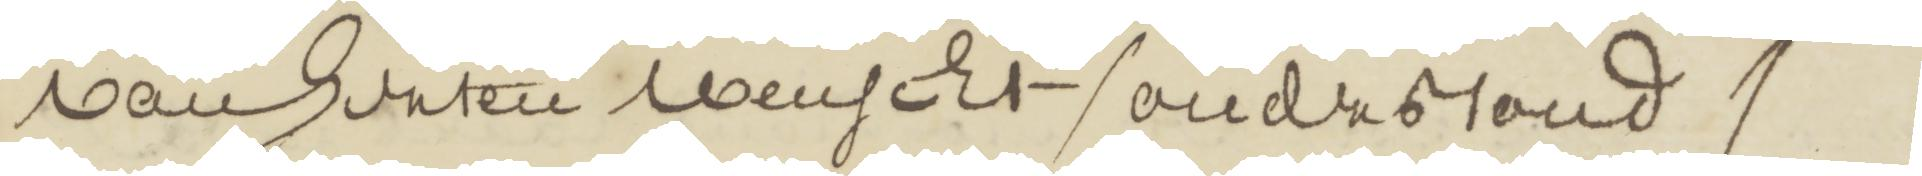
van herten wenscht /onderstond/
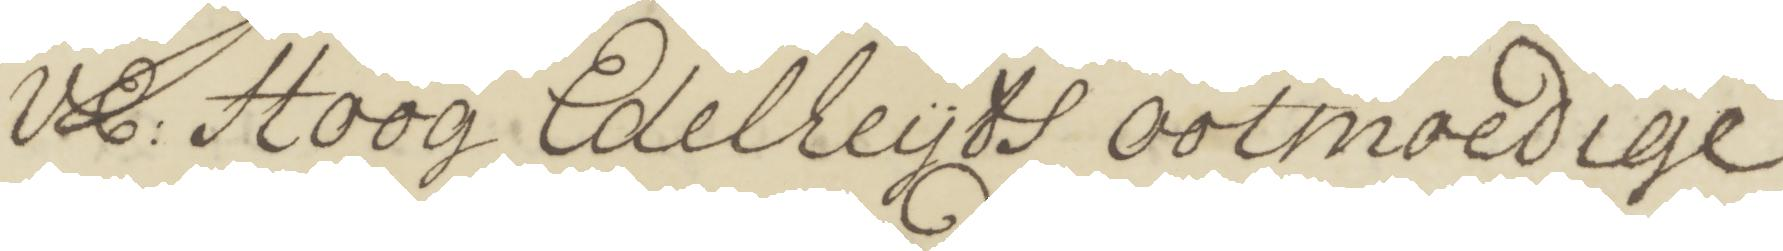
UE: Hoog Edelheijts ootmoedige
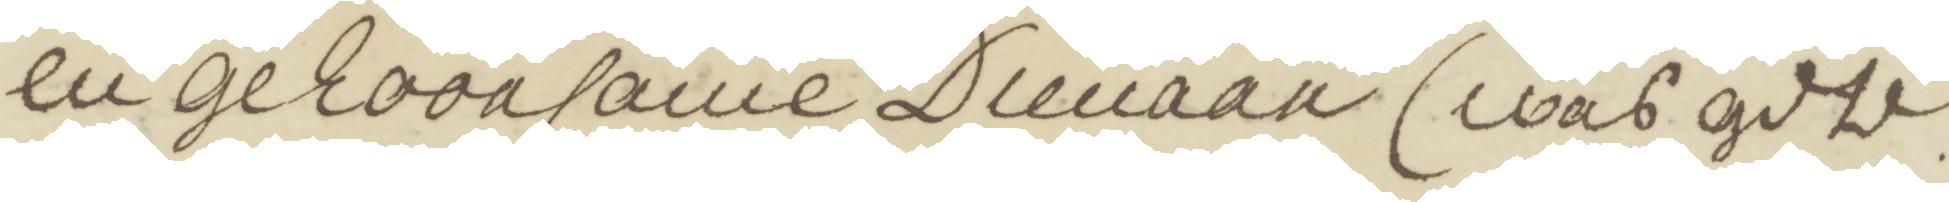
en gehoorsame Dienaar (was gete.
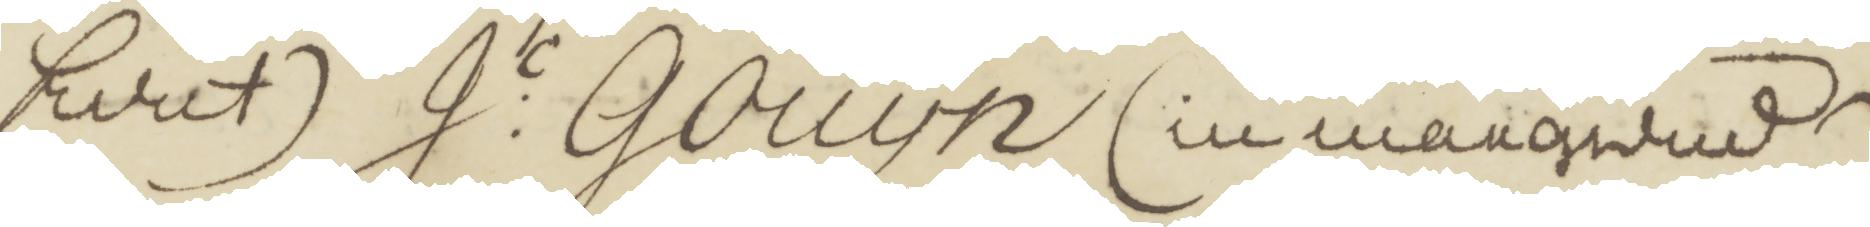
kent) J:r Gouijn (in margiene)
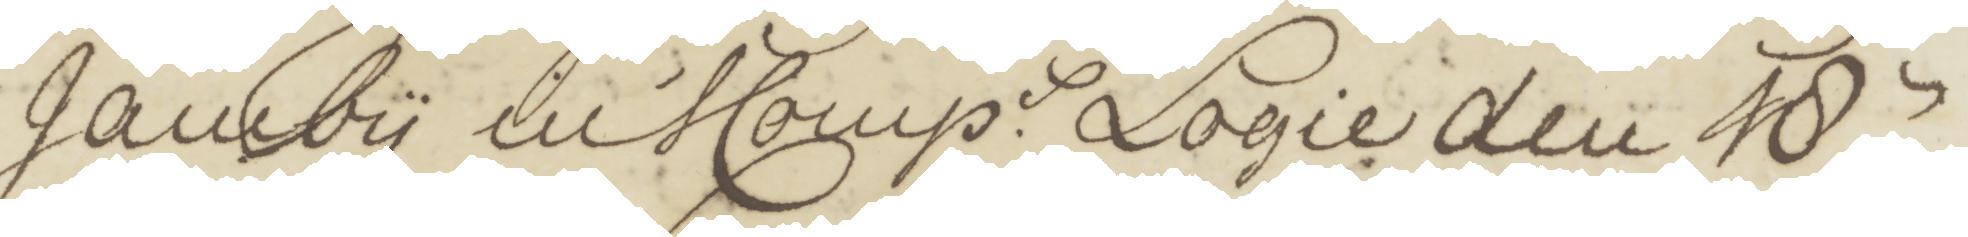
Jambij in 'sComp.s Logie den 18.en
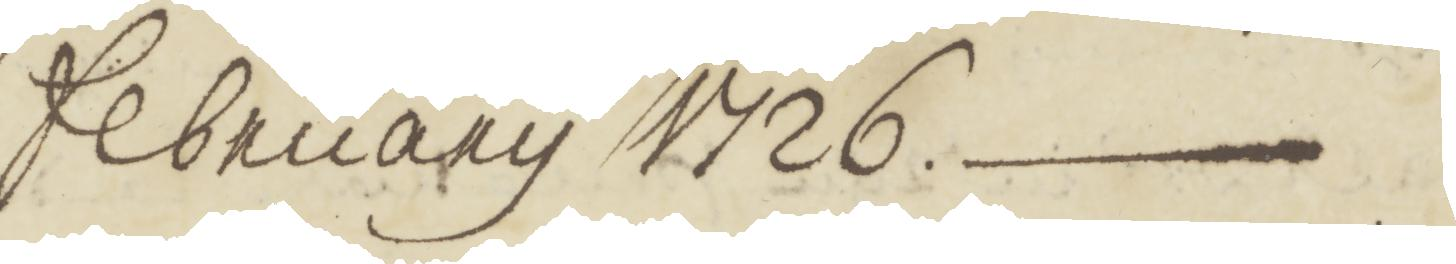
februarij 1726. —
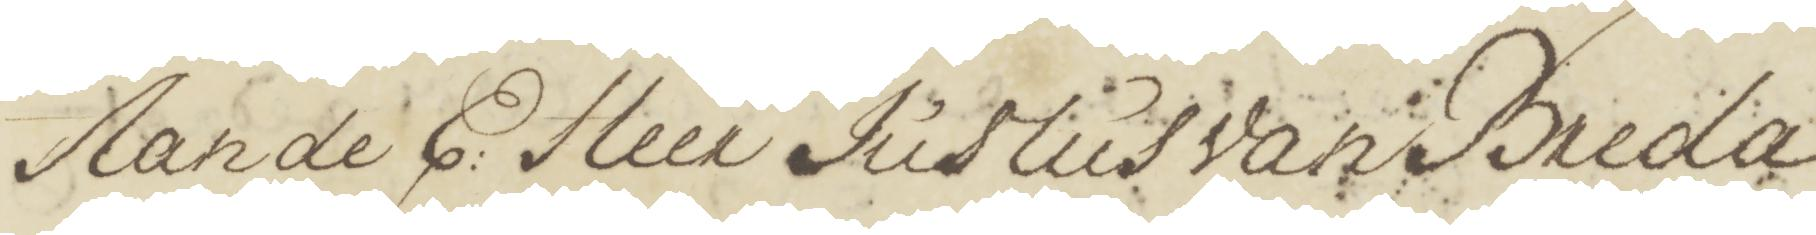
Aan de E: Heer Iustus van Breda
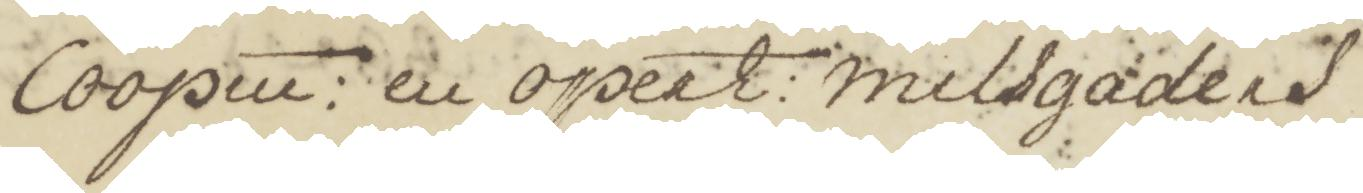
Coopm: en opperh: mitsgaders
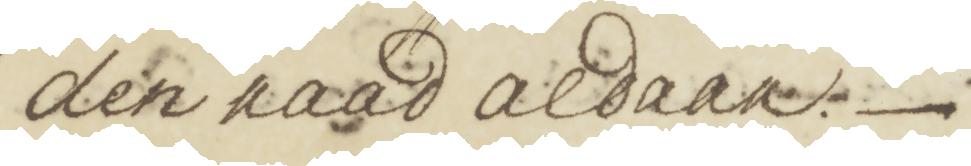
den raad aldaar. —
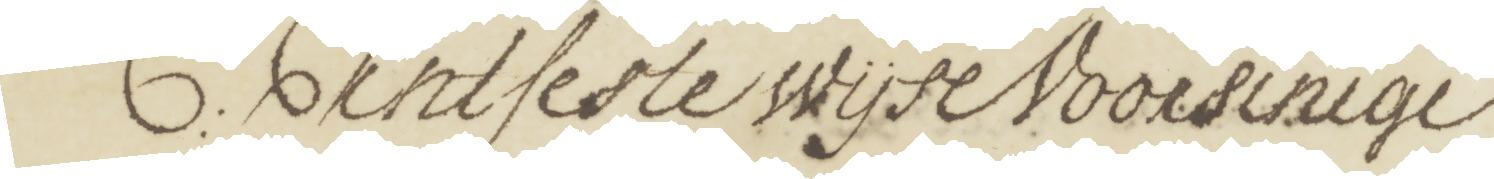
E: Erntseste wijse Voorsinige
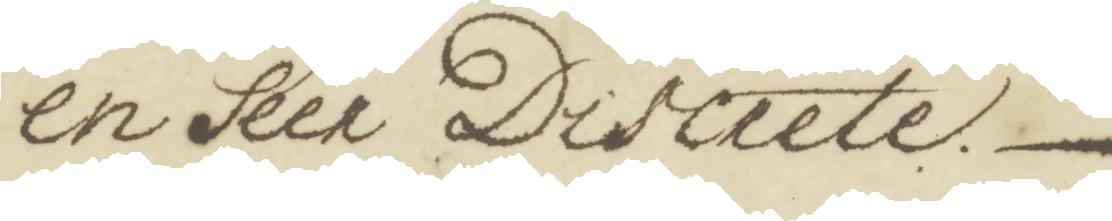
en seer Discrete. —
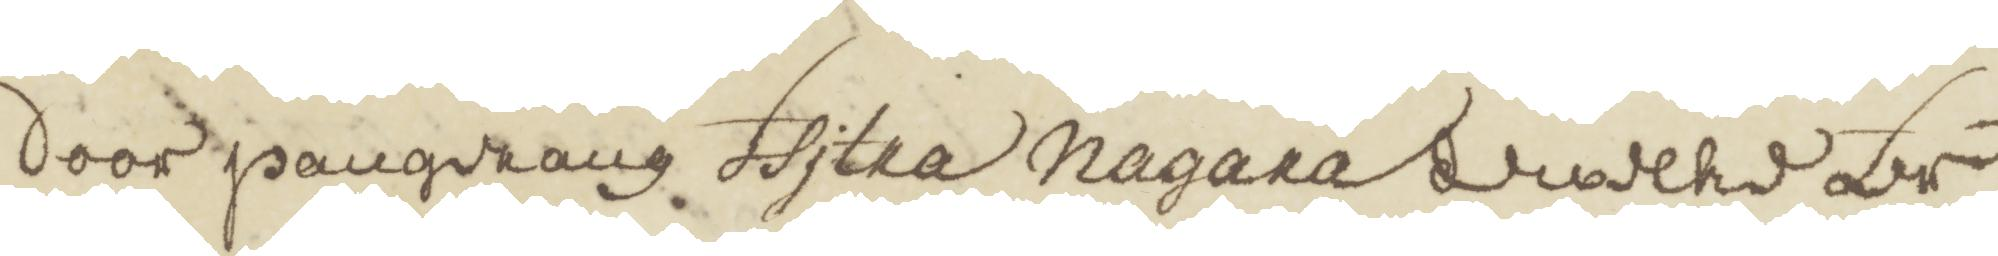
door pangerang tsjtra nagara dewelke ter
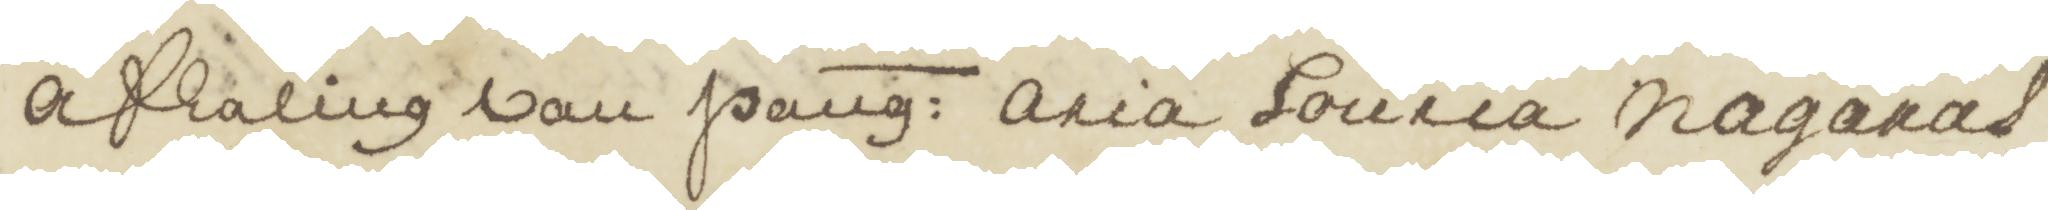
afhaling van pang: aria souria nagaras
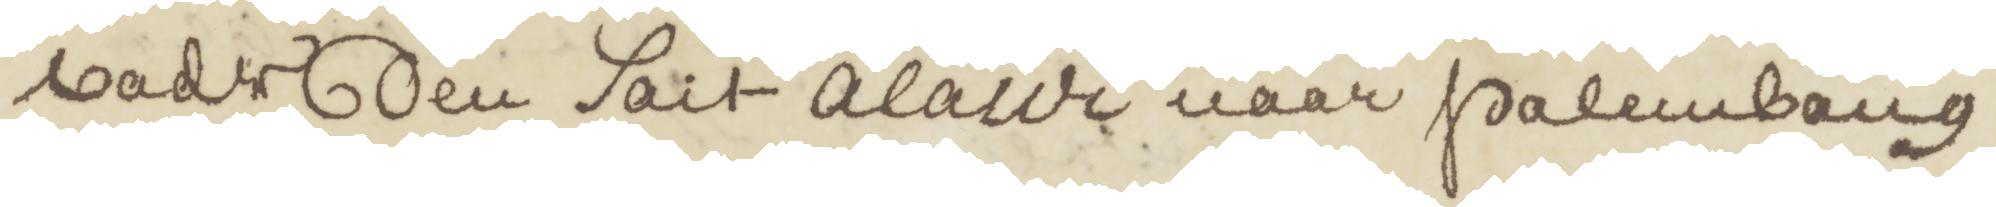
vader den sait alarei naar palembang
